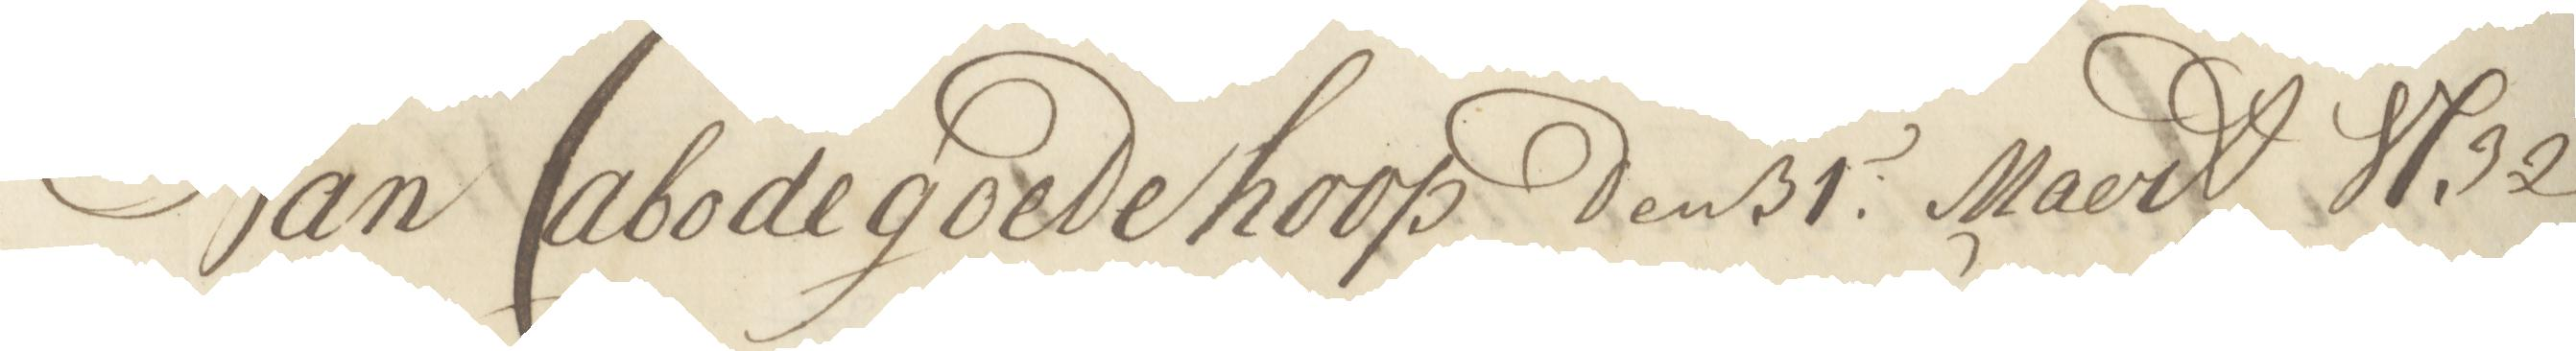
Van Cabo de goede hoop den 31:' Maert 1732
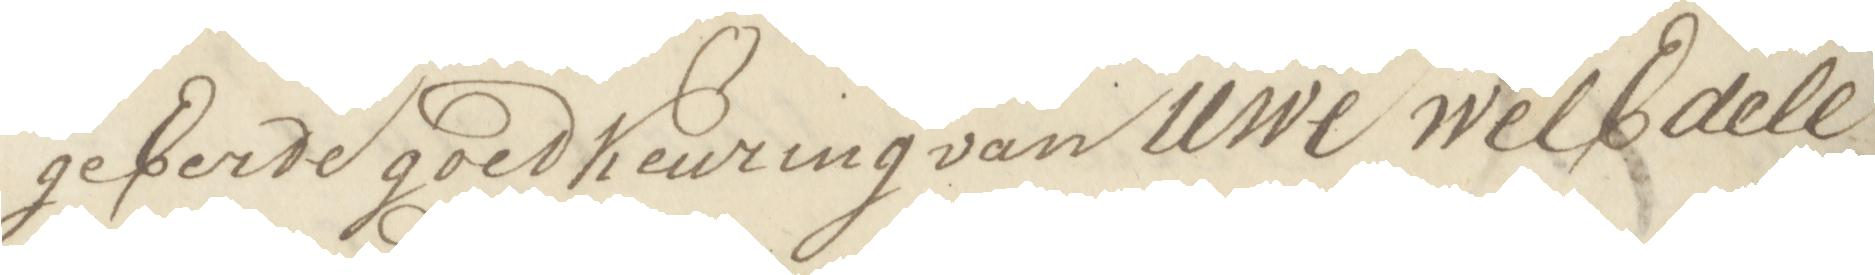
geEerde goedkeuring van uwe wel Edele
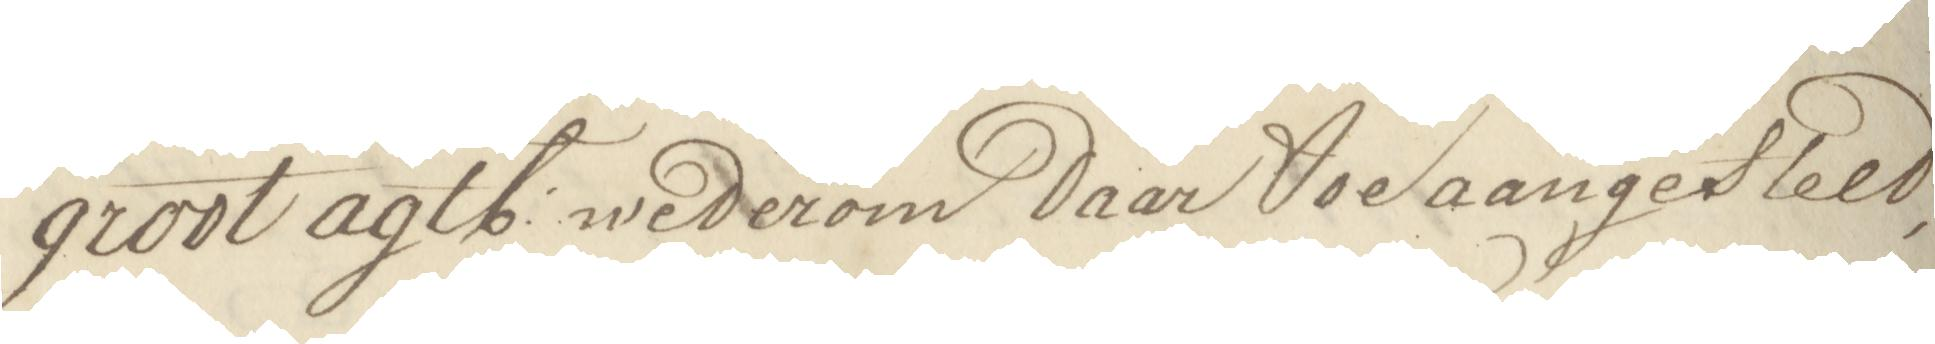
groot agtb: wederom daar toe aangesteld,
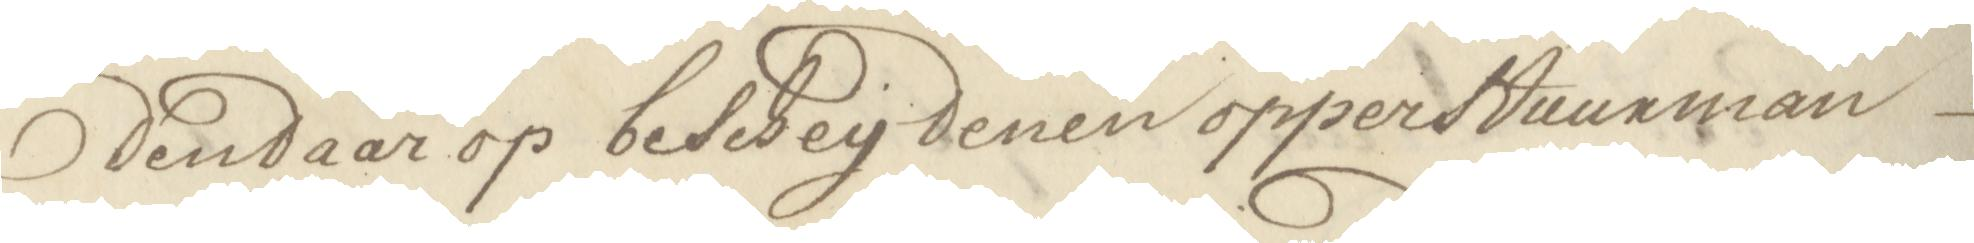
den daar op bescheijdenen opperstuurman
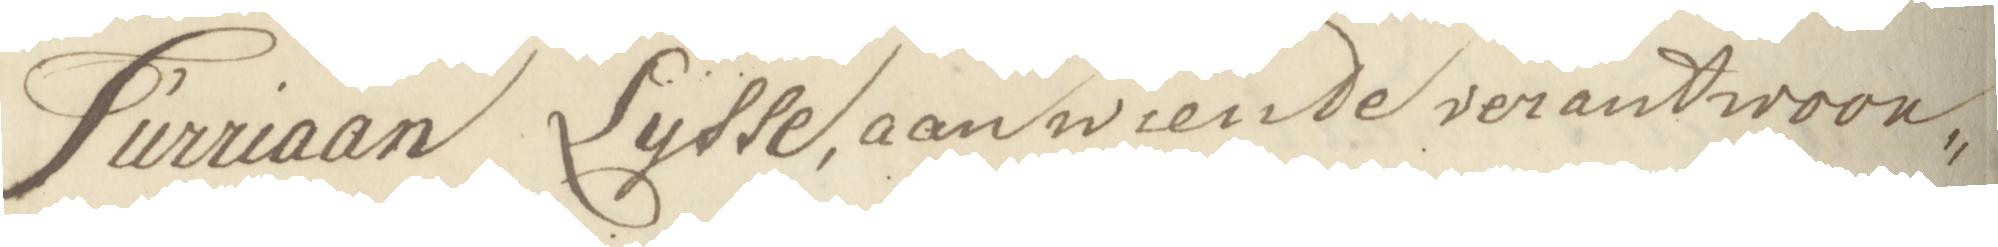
Jurriaan Lijsse, aan wien de verantwoor„
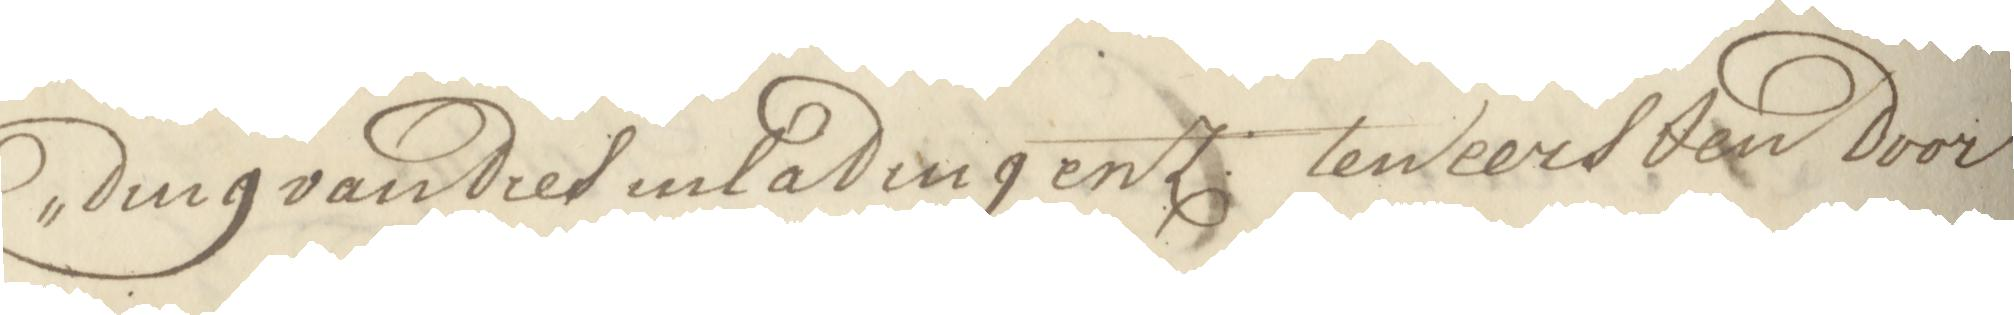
„ding van dies inlading enz: ten eersten door
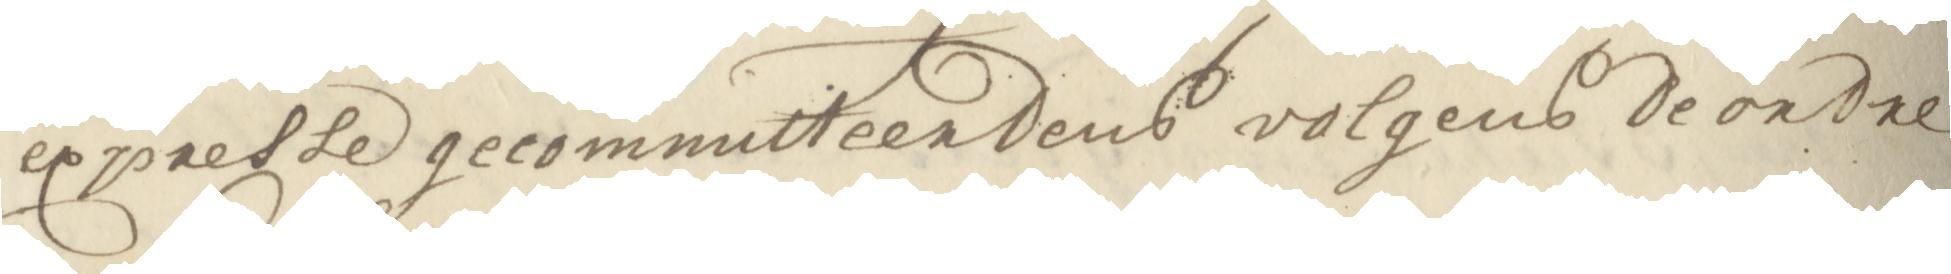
expresse gecommitteerdens volgens de ordre
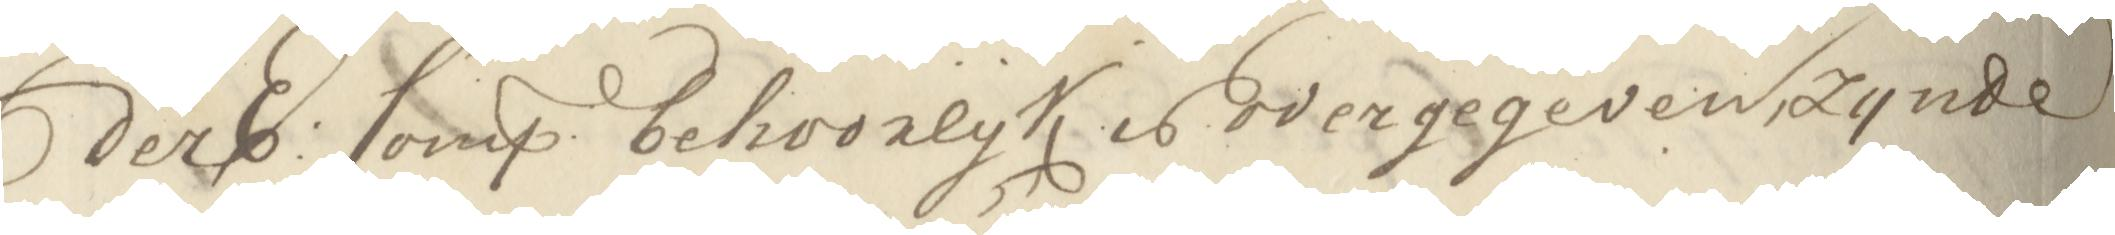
der E: Comp: behoorlijk is overgegeven, zynde
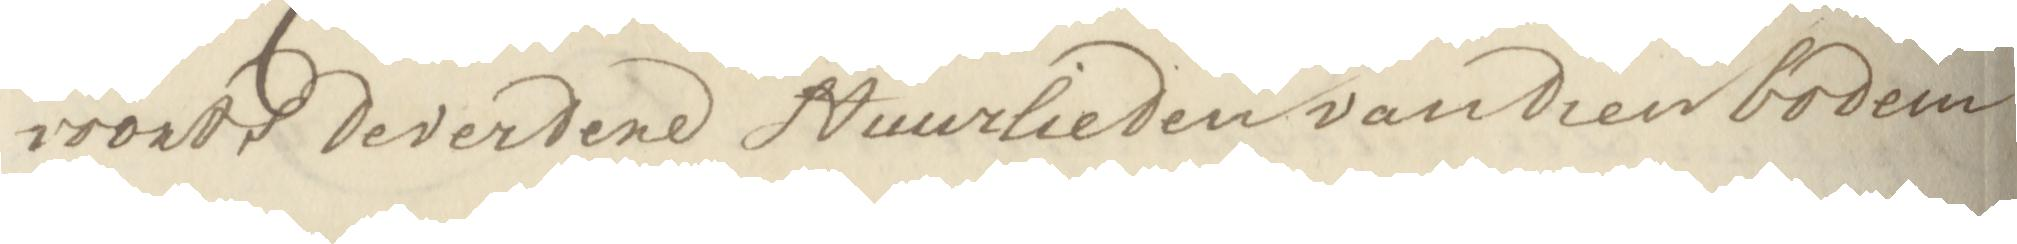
voorts de verdere stuurlieden van dien bodem
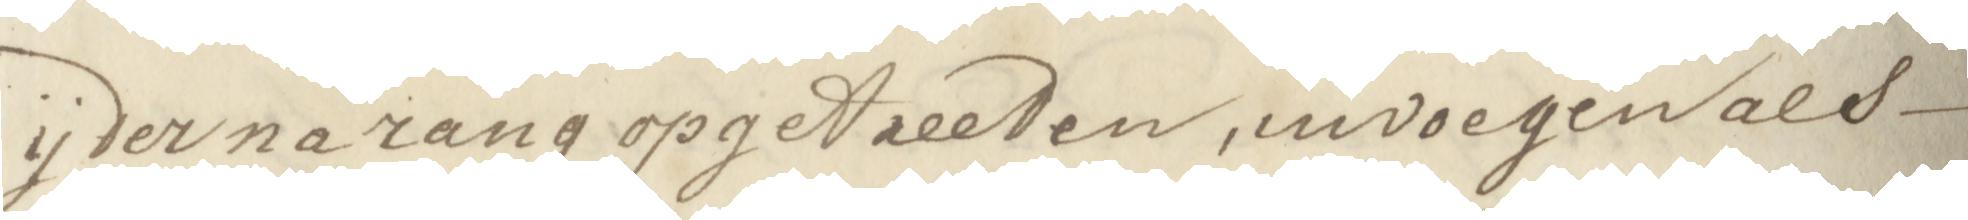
ijder na rang opgetreeden, invoegen als —
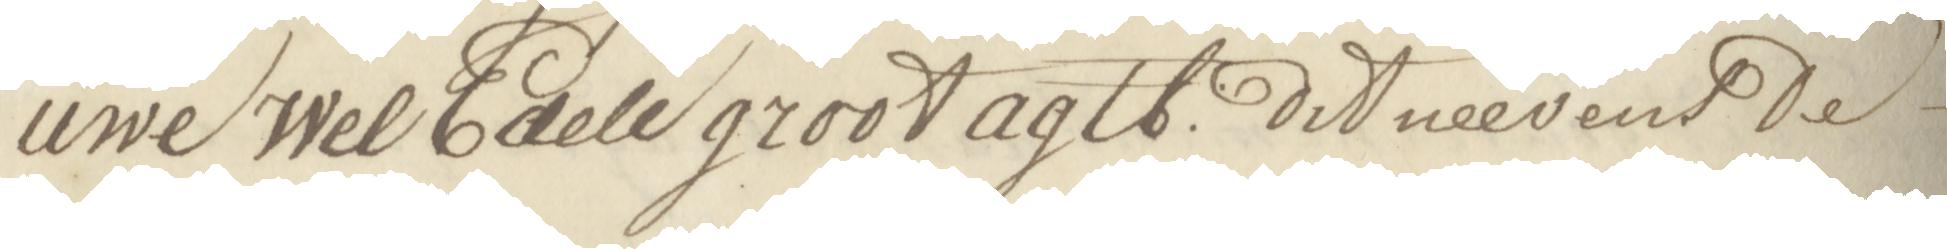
uwe wel Edele groot agtb: dit neevens de
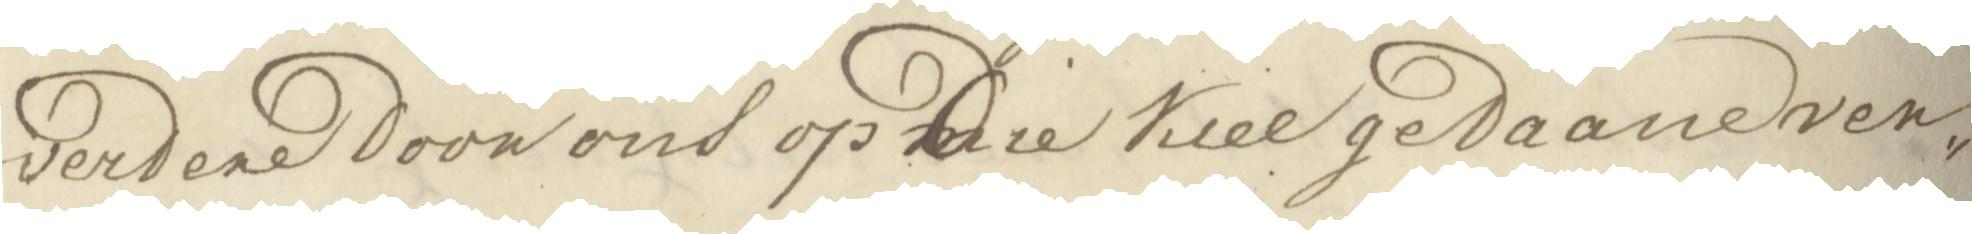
verdere door ons op die kiel gedaane ver„
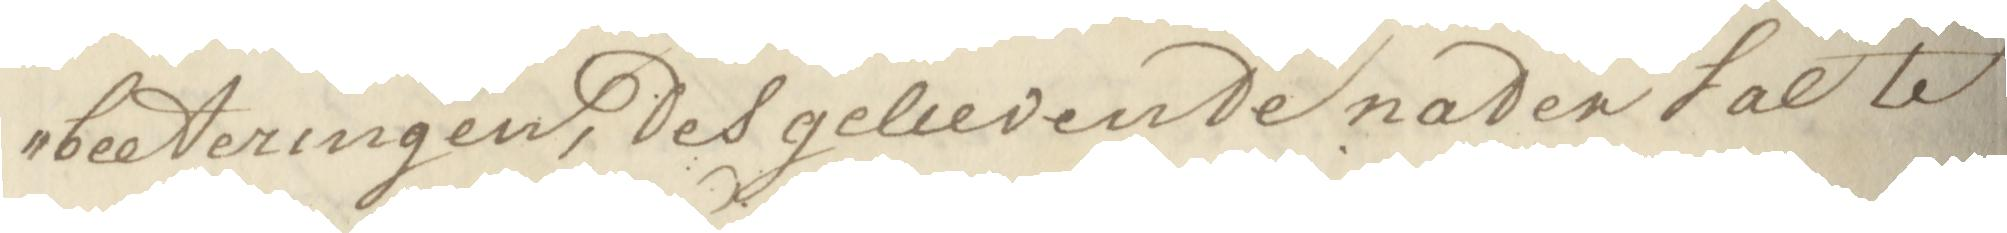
„beeteringen, des gelievende nader sal te
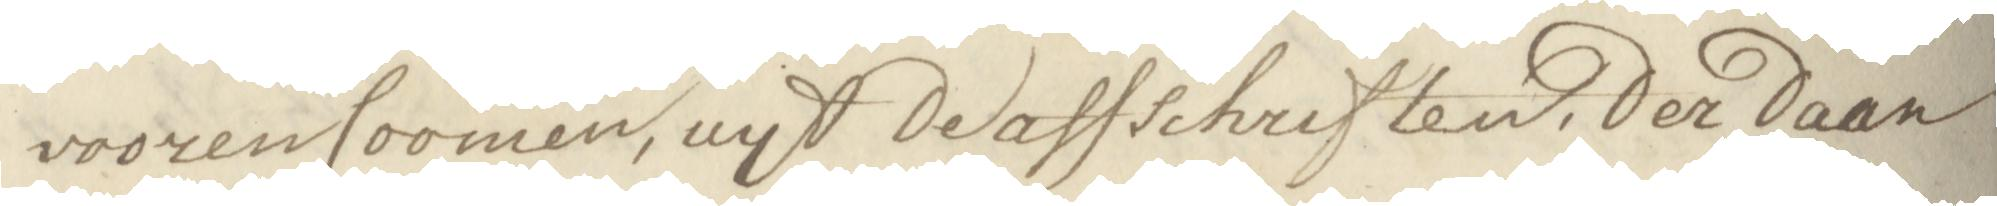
vooren Coomen, uijt de affschriften, der daar
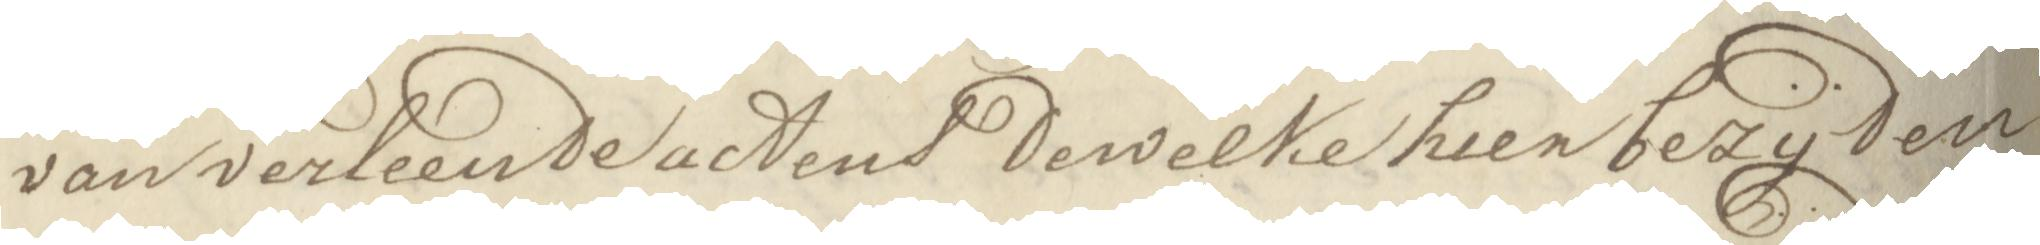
van verleende actens dewelke hier bezijden
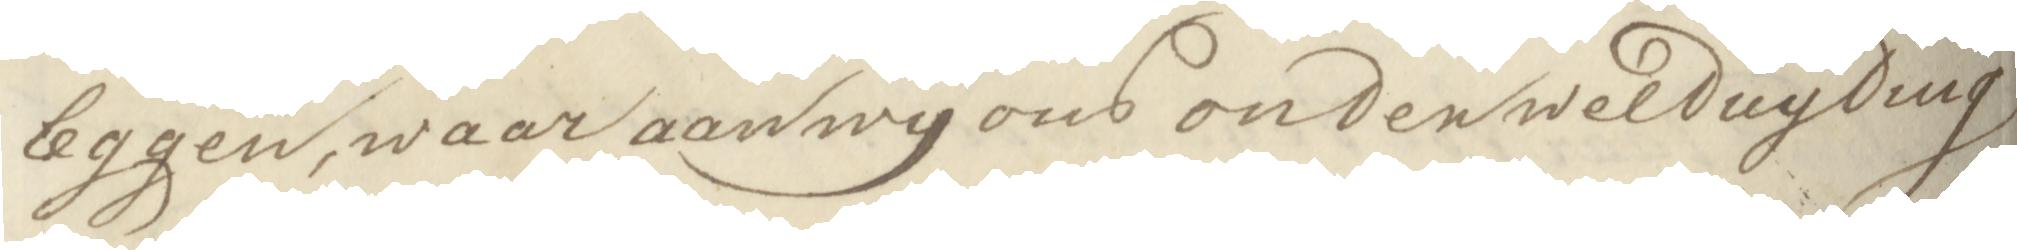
leggen, waar aan wij ons onder welduijding
